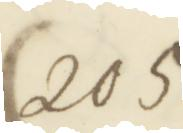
205
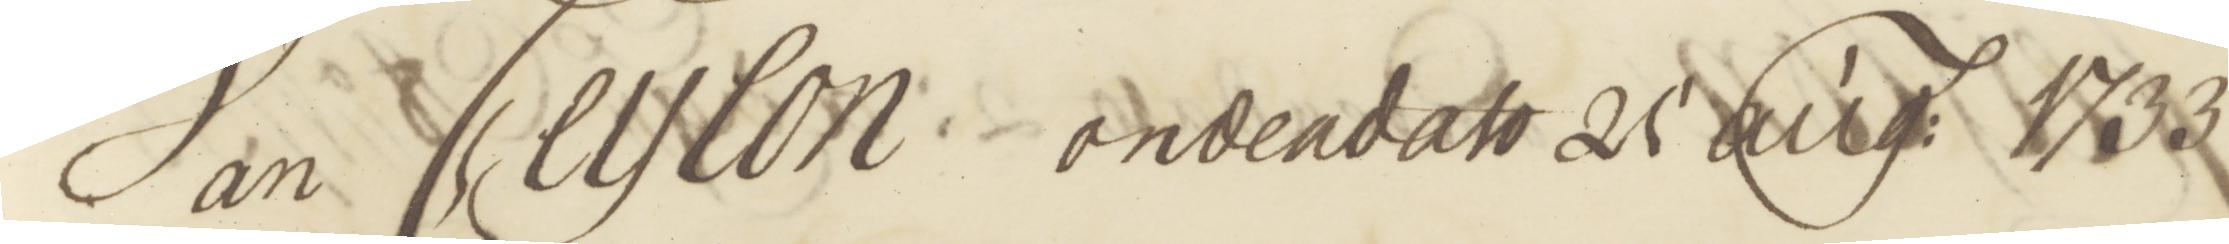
Van Ceylon onderdato 25´ aug:s 1733
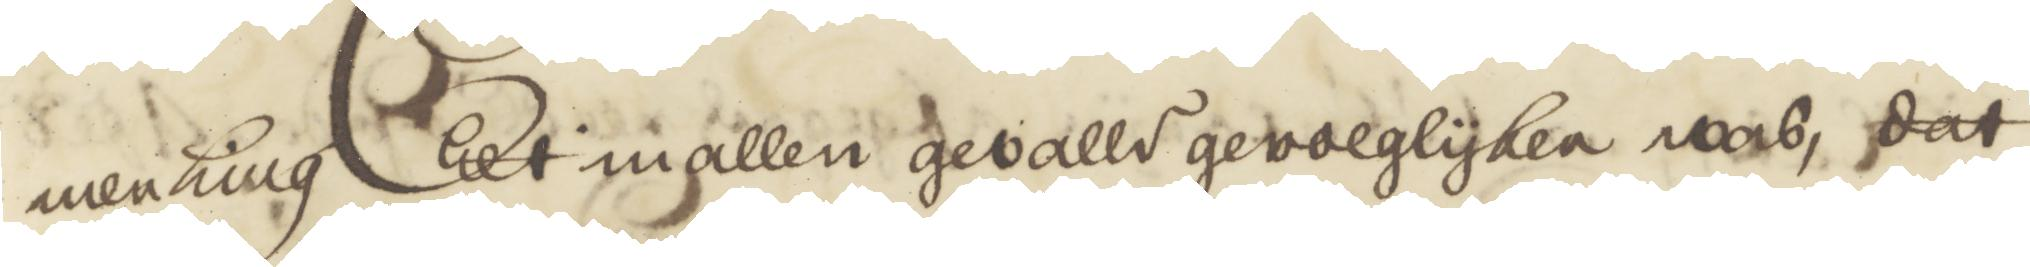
merking het in allen gevalle gevoeglijker was, dat
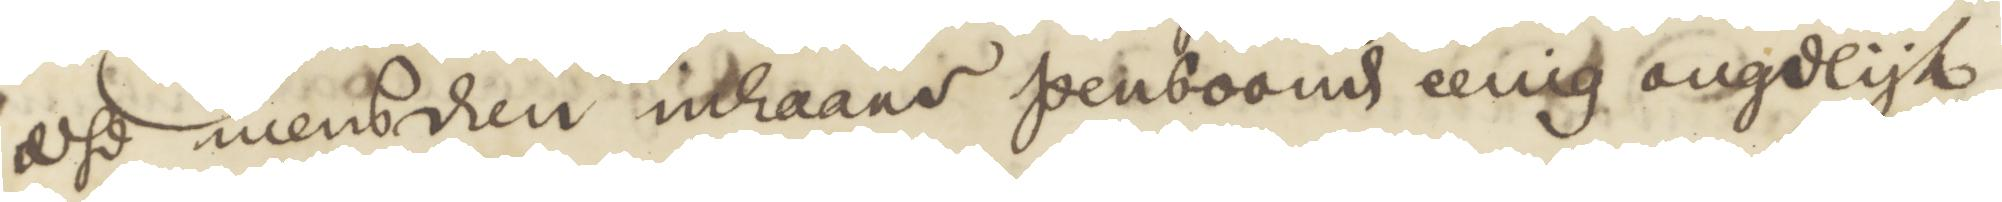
dese menschen inhaare pensoonen eenig ongelijk
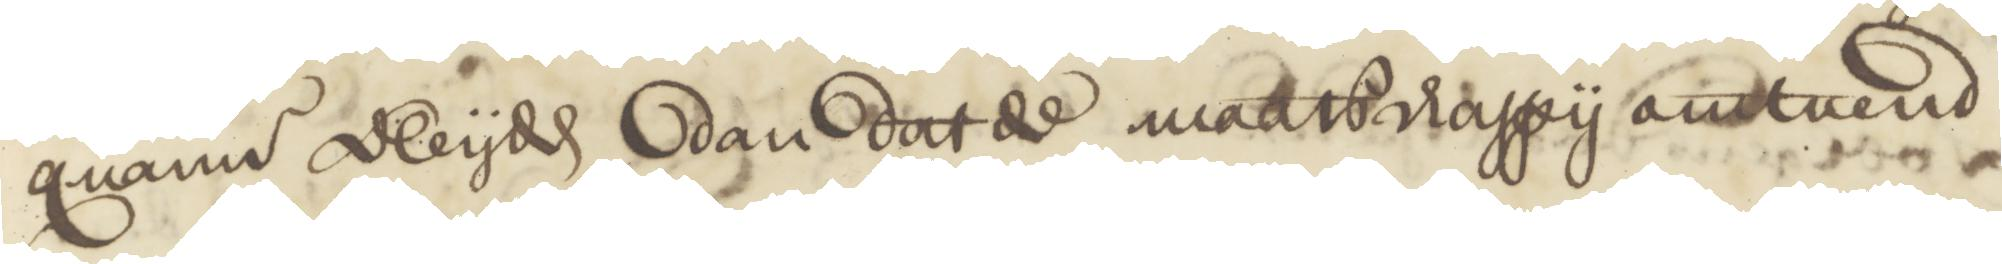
quame teleijden dan dat de maatschappij omtrend
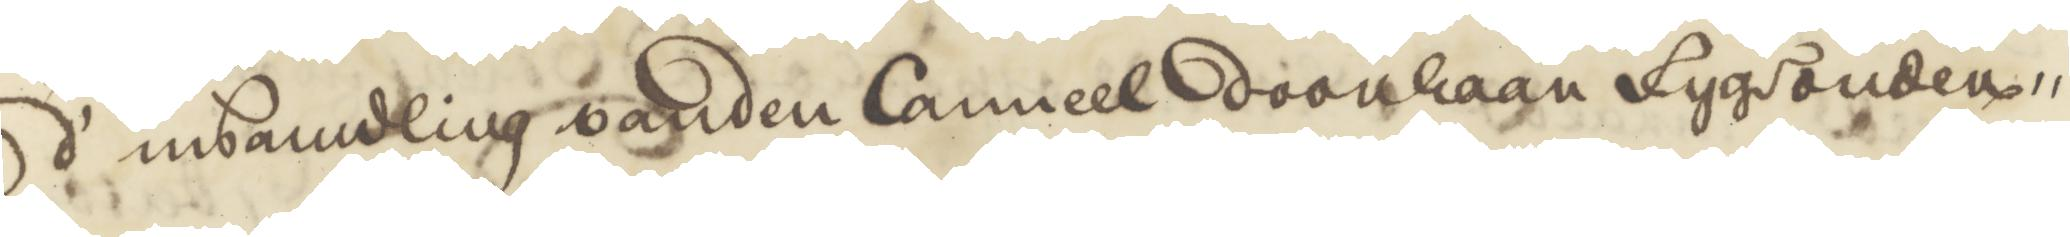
d’ insameling van den Canneel door haar Eyge onder„
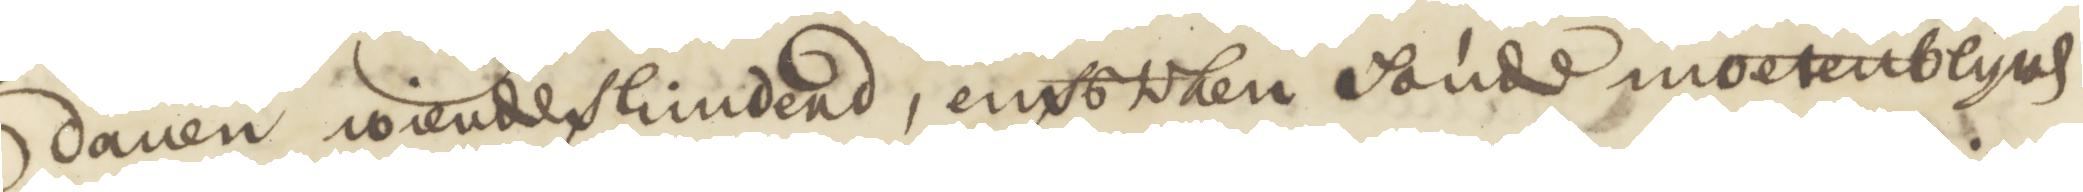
danen wierde verhinderd, en versteken Soude moeten blyven
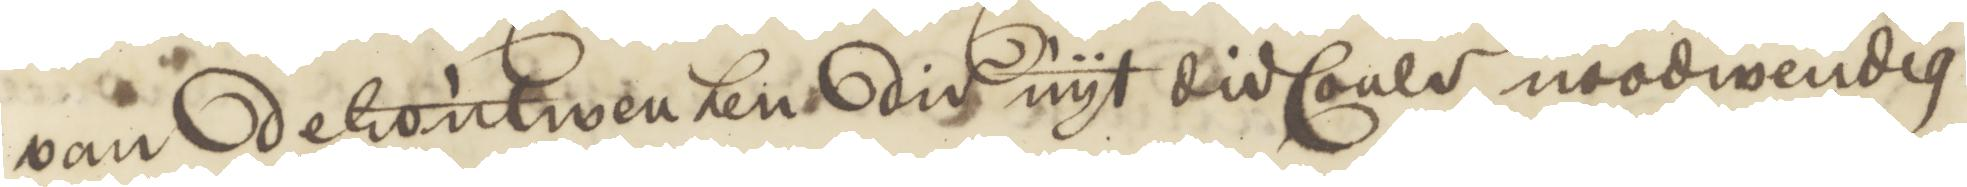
van de houtwerken die uijt die Corle noodwendig
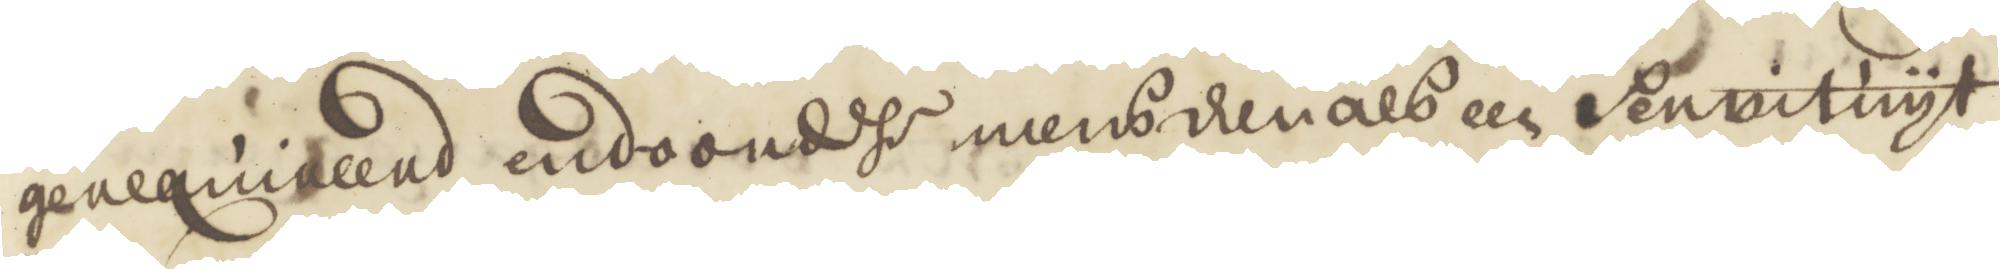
gerequireerd en door dese menschen als een Servituijt
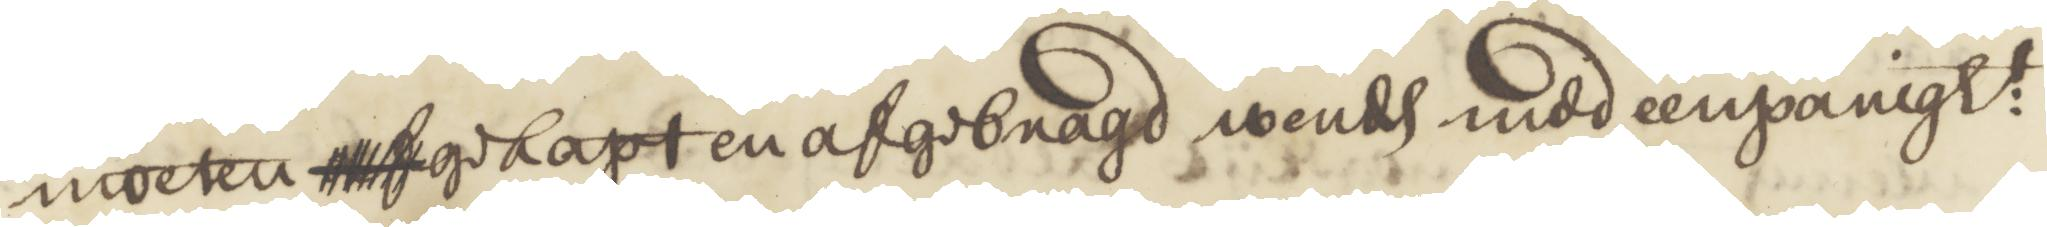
moeten afgekapt en afgebragd werden med eenparigh:t
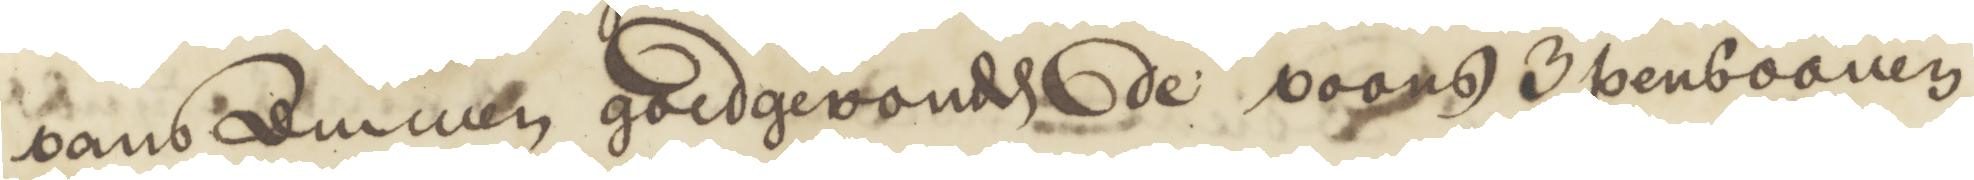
van stemmen goedgevonden de voors 3 persoonen
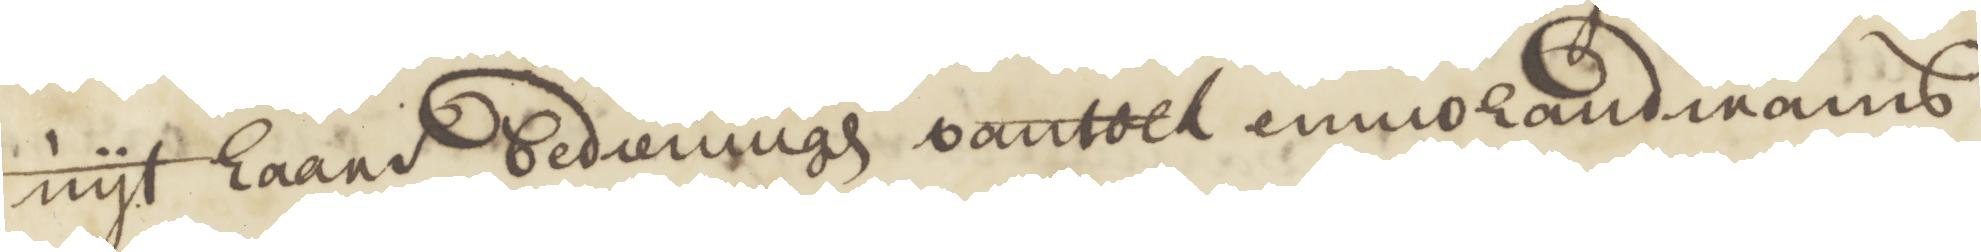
uijt haare bedieningen van tolk en mohandirams
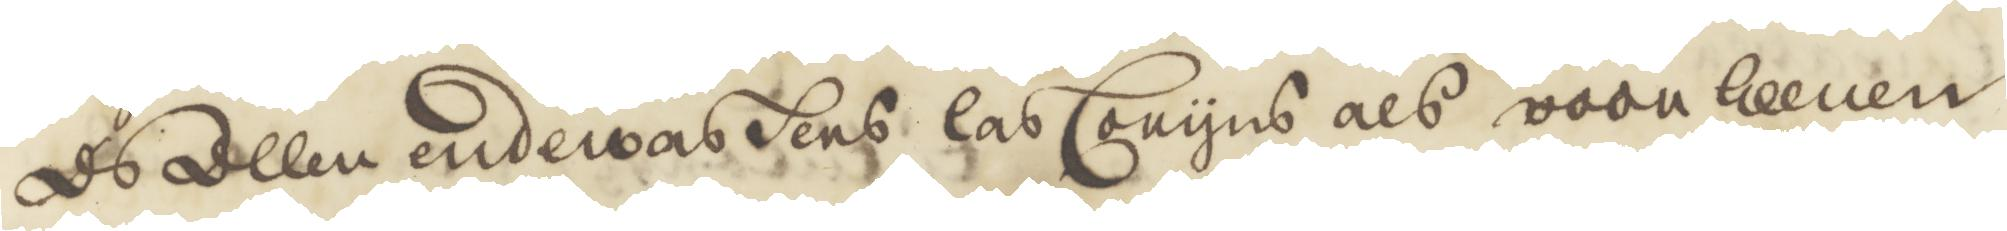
testellen en de wassers lascorijns als voor heenen
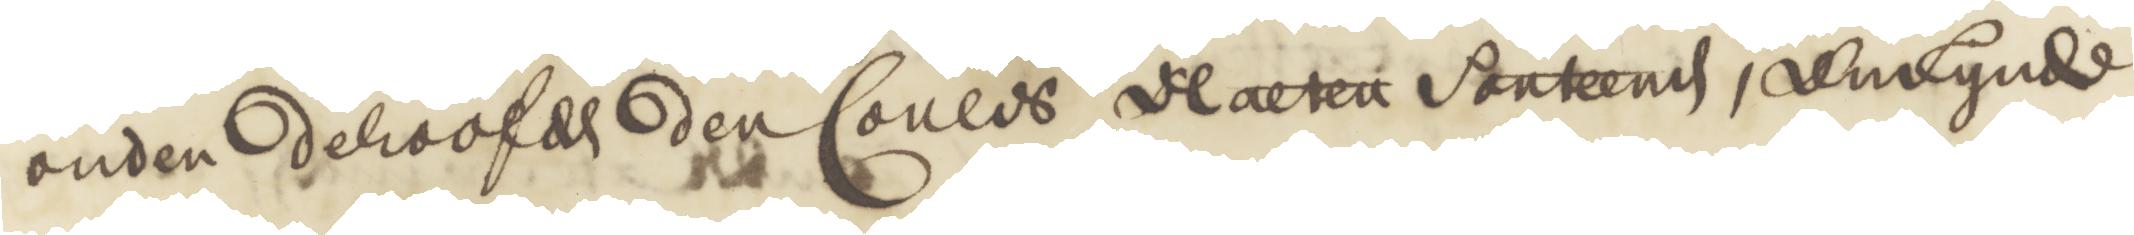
onder de hoofden der Corles te laeten Sorteeren, ten Eynde
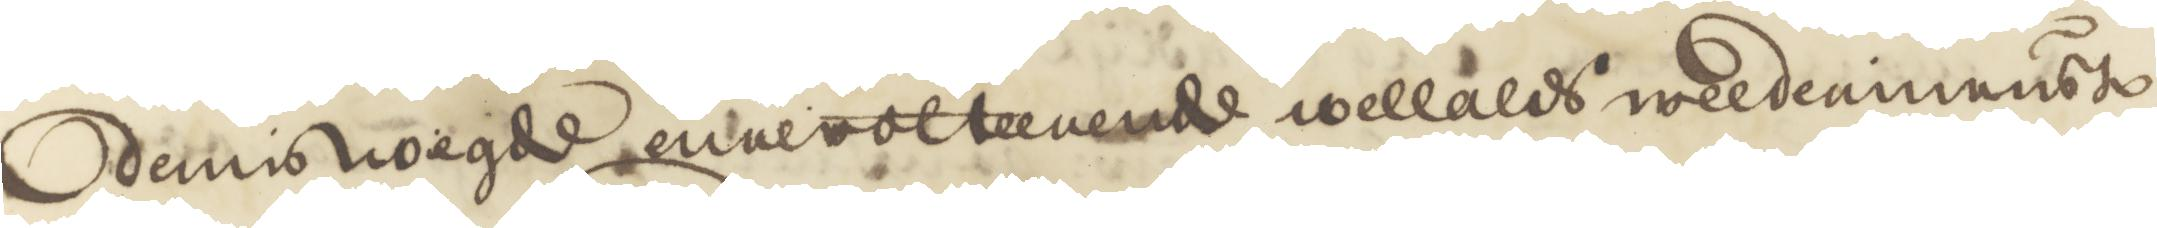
de misnoegde en revolteerende wellales weeder in ruste
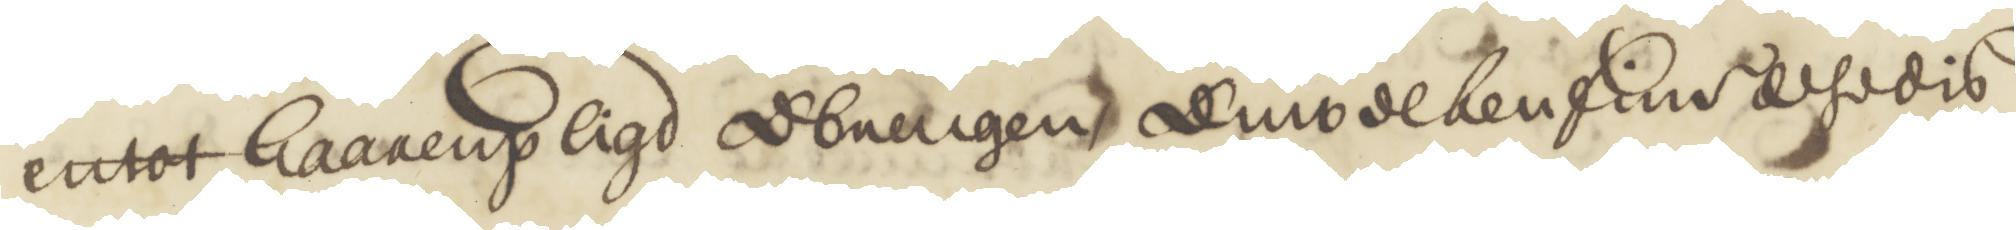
en tot haarenpligd tebrengen tenwelken fine dese dis
